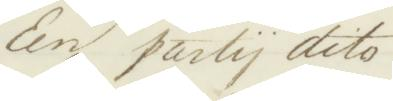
Een partij dito
